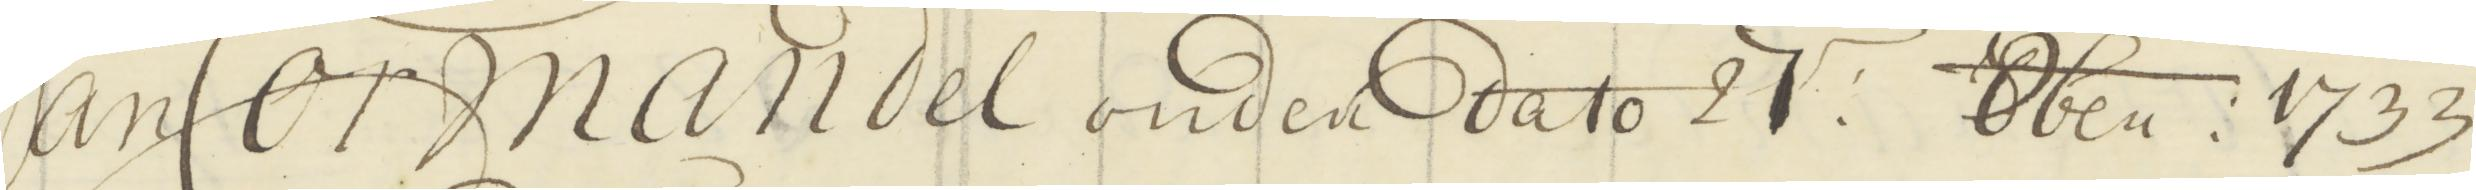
Van Cormandel onder dato 27:' 8ber: 1733
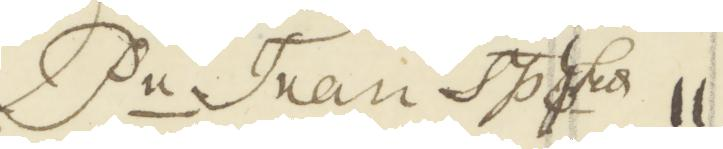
Pr Tran sp p-ken 11
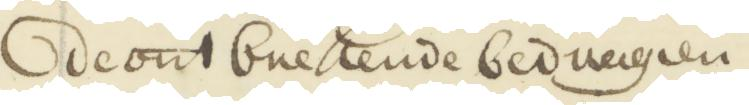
de ontbrekende bedroegen
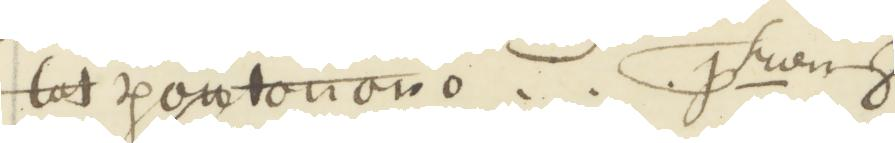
tot portonovo - - - p_ken 8
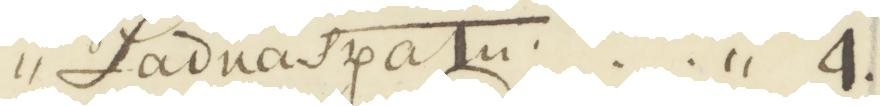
„ Sadraspatn: - - - „ 4.
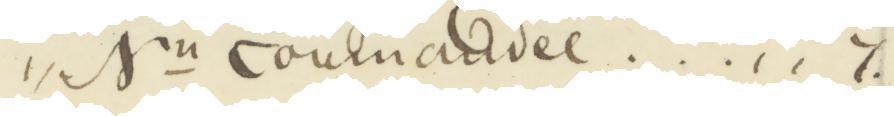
„ N-r Cormandel - - - „ 7.
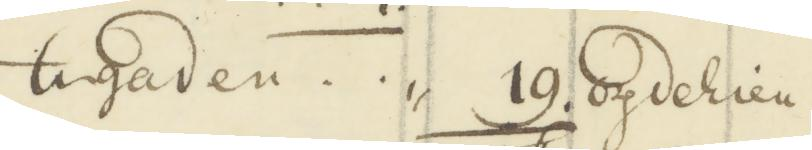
tegoeden - - „ 19. op dehier
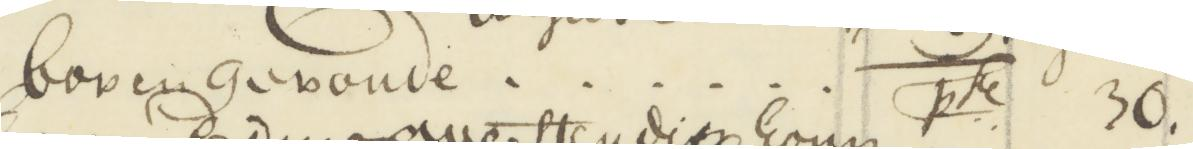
boven gevonde - - - - - - p„k 30.
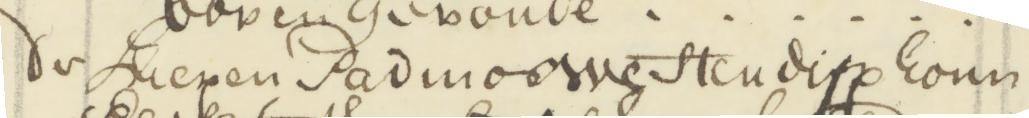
de schepen Padmos westerdyxhorn
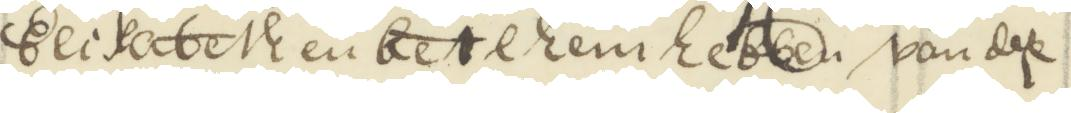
Elisabeth en betlhem hebben van dese
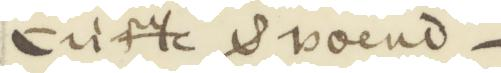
custe vervoerd -
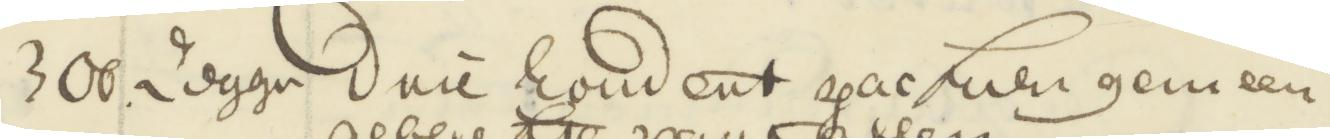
300. zegge drie hondert packen gem een
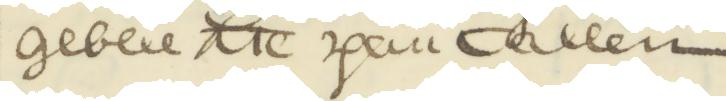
gebleekte pan callen
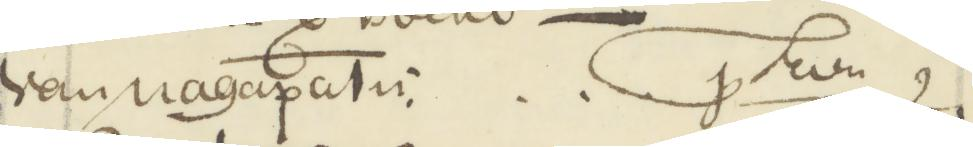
van nagapatn: - - - p_ken 2.
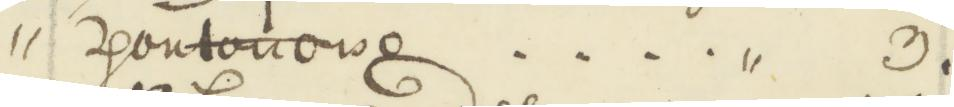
„ portonovo - - - - „ 3.
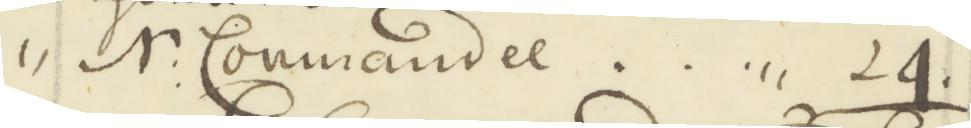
„ N: Cormandel - - -„ 24.
